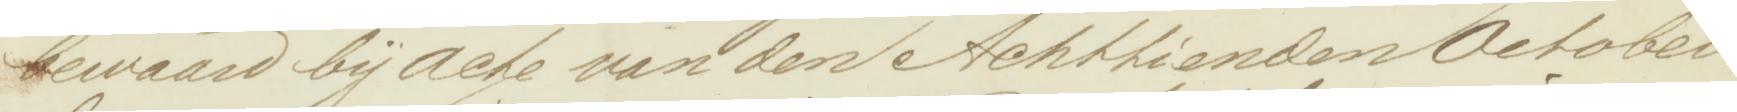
bewaard bij acte van den Achttienden October
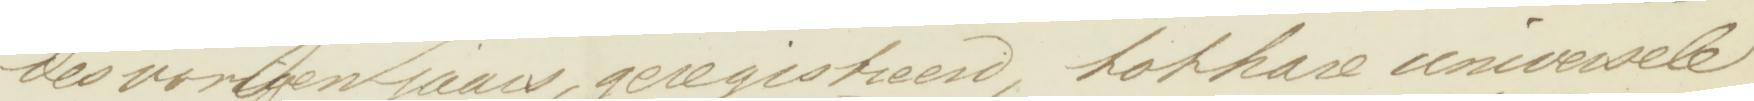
des vorigen jaars, geregistreerd, tot hare universele
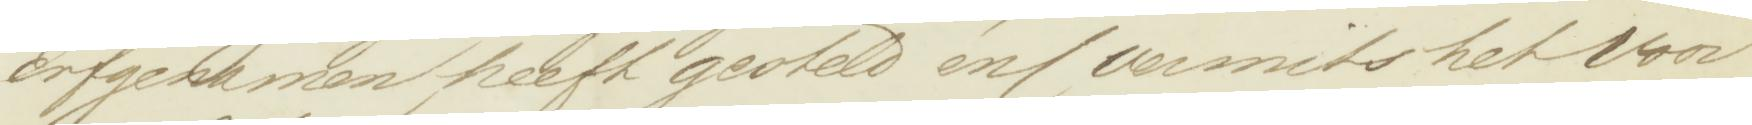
Erfgenamen heeft gesteld en (vermits het voor
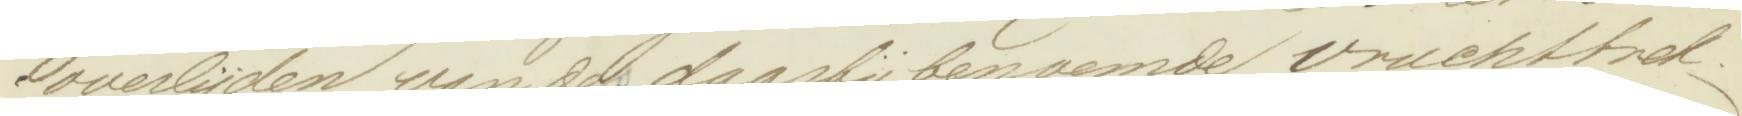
overlijden van de daarbij benoemde vruchttrek.
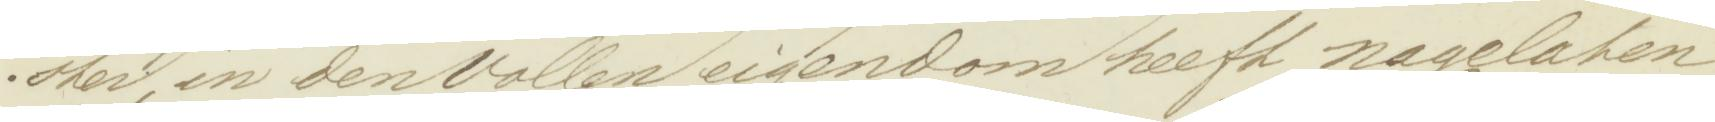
„ster, in den vollen eigendom heeft nagelaten
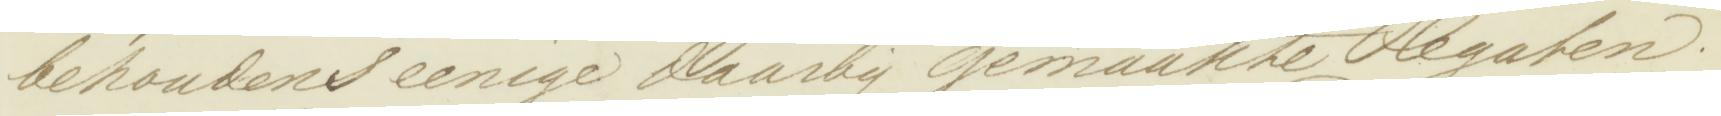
behoudens eenige daarbij gemaakte legaten.
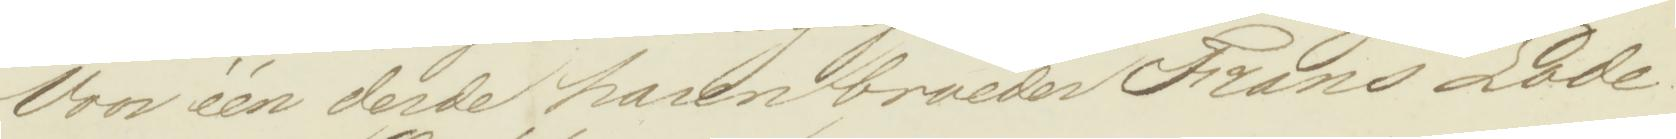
voor één derde haren broeder Frans Lode.
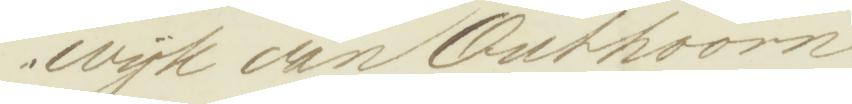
„wijk van Outhoorn
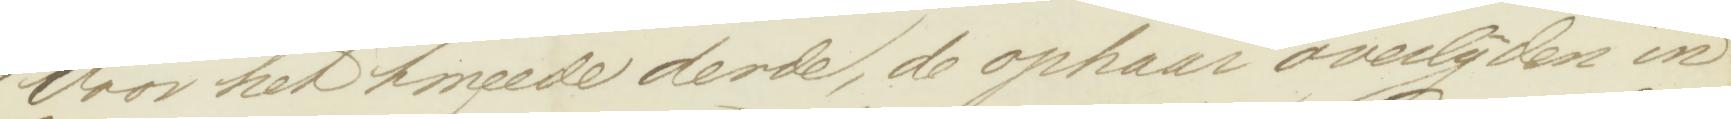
voor het tweede derde, de ophaar overlijden in
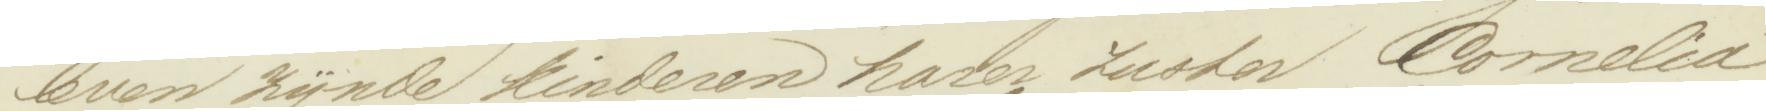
leven zijnde kinderen harer zuster Cornelia
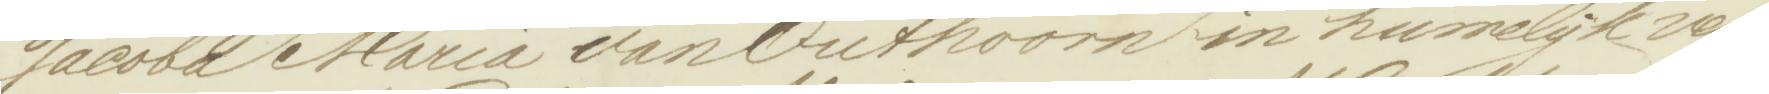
Jacoba Maria van Outhoorn in huwelijk ver.
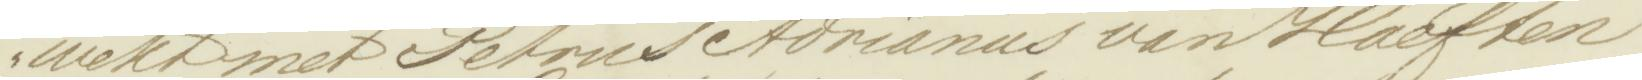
„wekt met Petrus Adrianus van Haeften
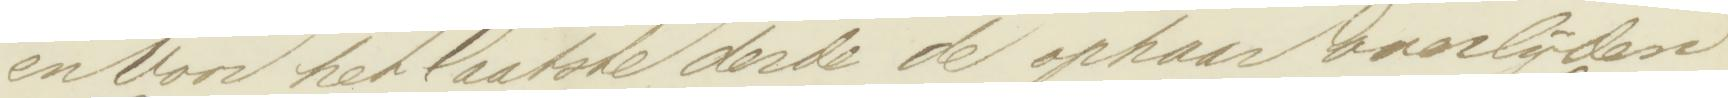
en voor het laatste derde de ophaar overlijden
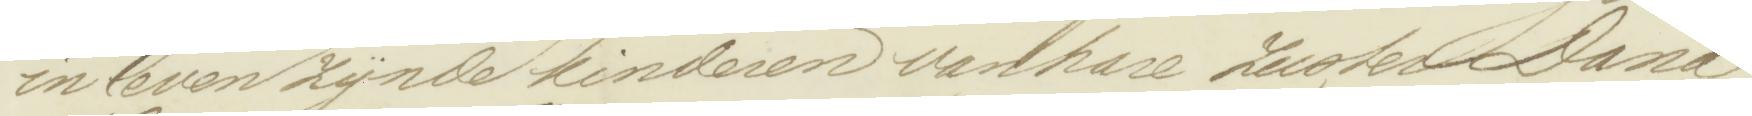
in leven zijnde kinderen van hare Zuster Dana
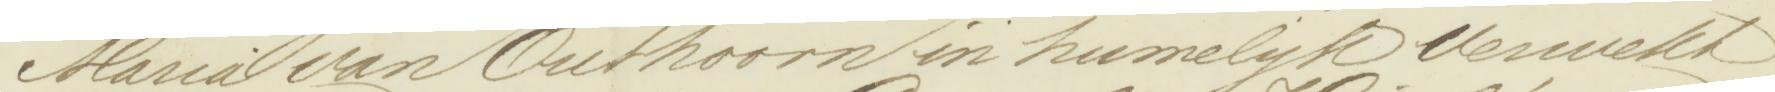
Maria van Outhoorn in huwelijk verwekt
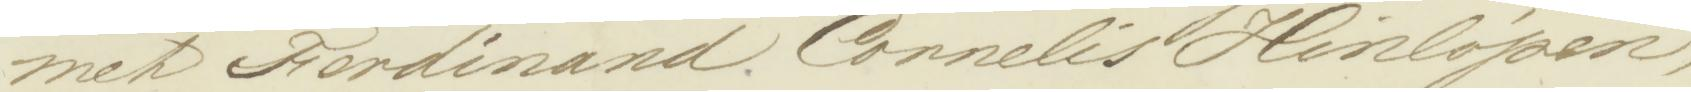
met Ferdinand Cornelis Hinlopen
